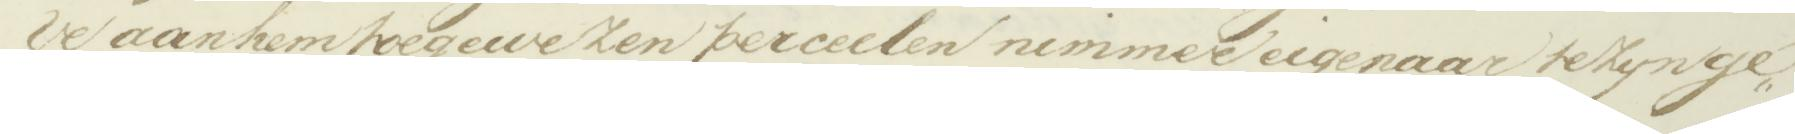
ve aan hem toegewezen perceelen nimmer eigenaar te zyn ge„
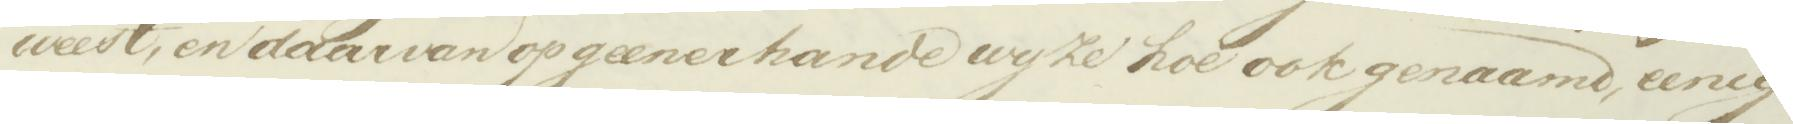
weest, en daarvan op geenerhande wyze hoe ook genaamd, eenig
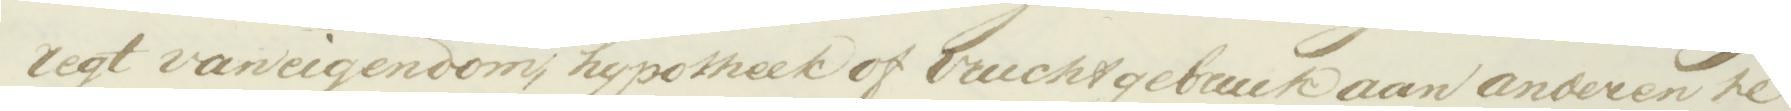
regt van eigendom, hypotheek of vruchtgebruik aan anderen te
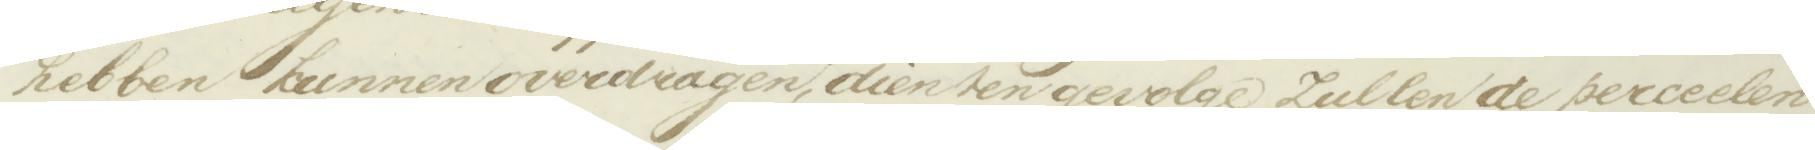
hebben kunnen overdragen, dien ten gevolge zullen de perceelen
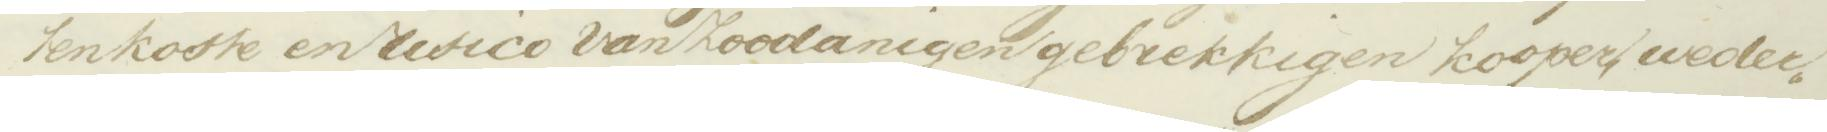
ten koste en risico van zoodanigen gebrekkigen kooper weder„
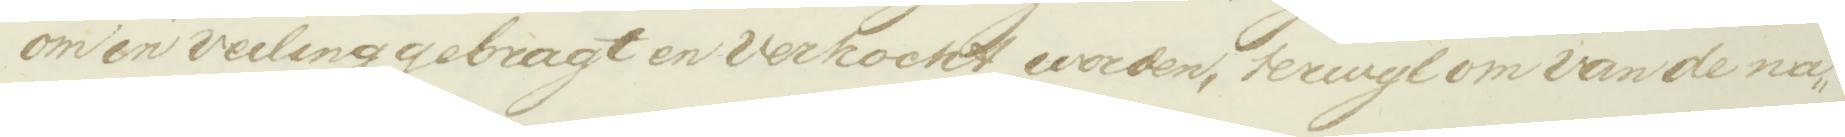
om in veiling gebragt en verkocht worden, terwijl om van de na„
